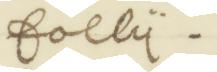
foelij
